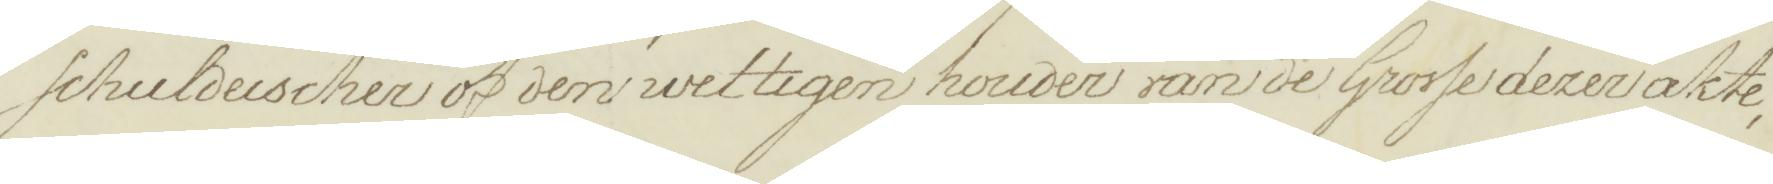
schuldeischer of den wettigen houder van de Grosse dezer akte„
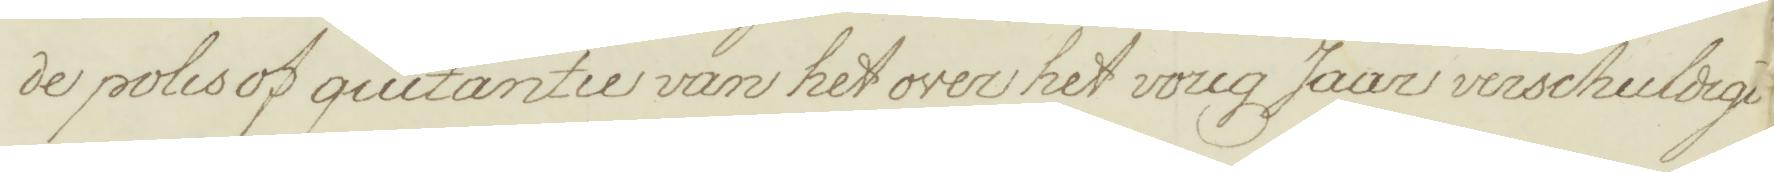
de polis of quitantie van het over het vorig Jaar verschuldigd
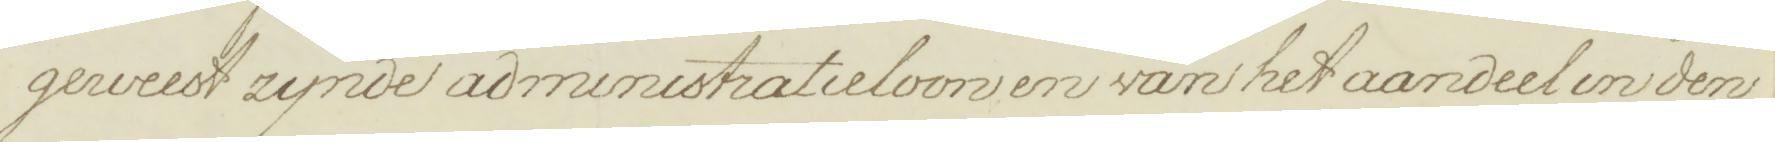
geweest zynde administratieloon en van het aandeel in den
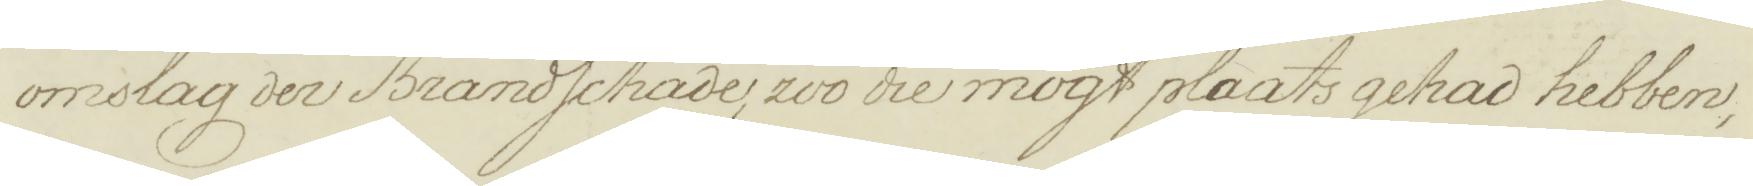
omslag der Brandschade, zoo die mogt plaats gehad hebben„
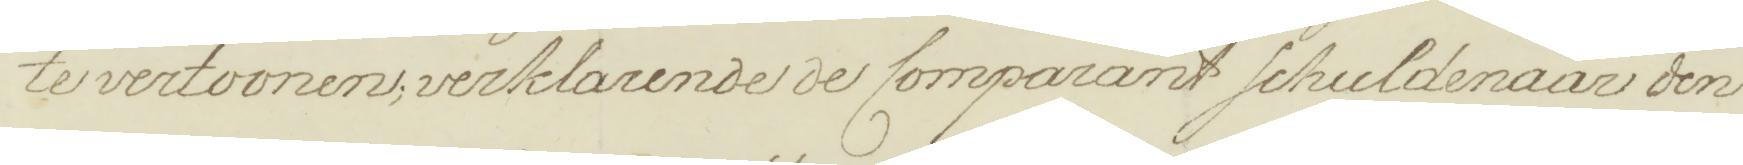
te vertoonen, verklarende de Comparant Schuldenaar den
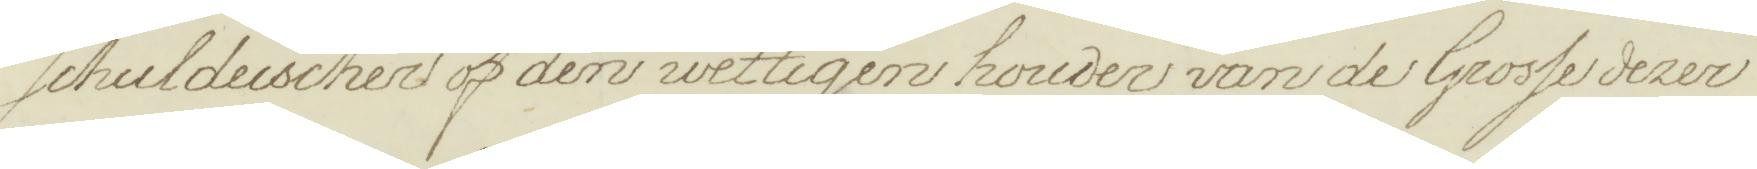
Schuldeischer op den wettigen houder van de Grosse dezer
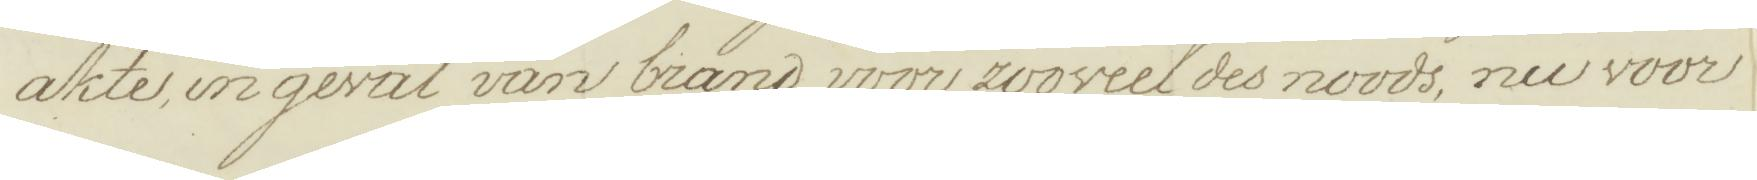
akte, in geval van brand voor zooveel des noods, nu voor
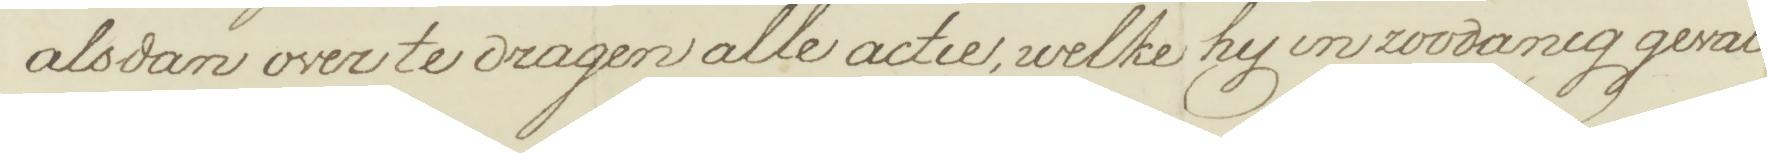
als dan over te dragen alle actie, welke hy in zoodanig geval
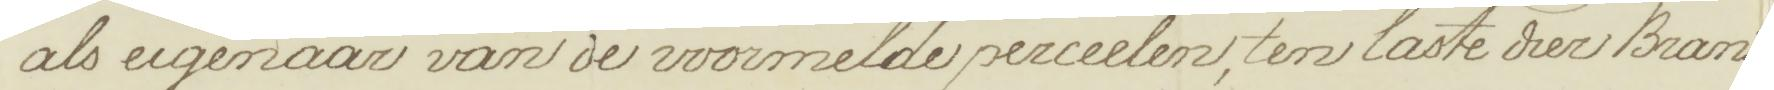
als eigenaar van de voormelde perceelen, ten laste dier Brand
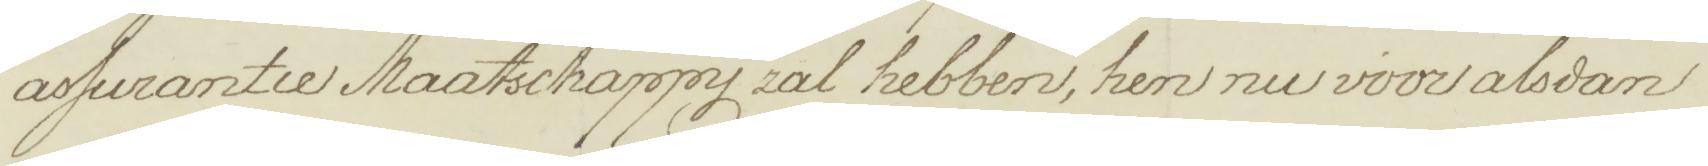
assurantie Maatschappy zal hebben, hen nu voor als dan
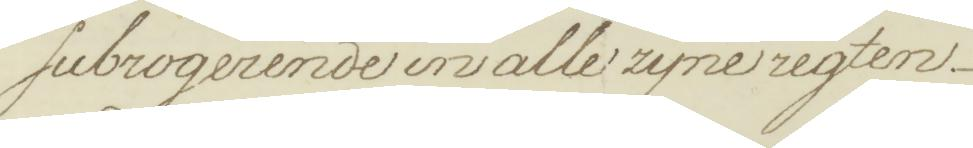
subrogerende in alle zyne regten.
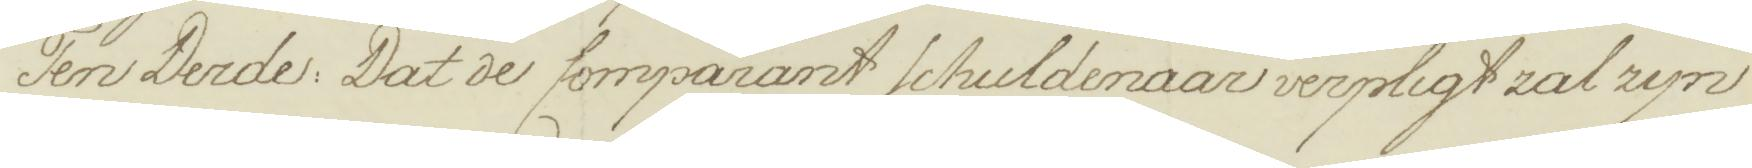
Ten Derde: Dat de Comparant Schuldenaar verpligt zal zyn
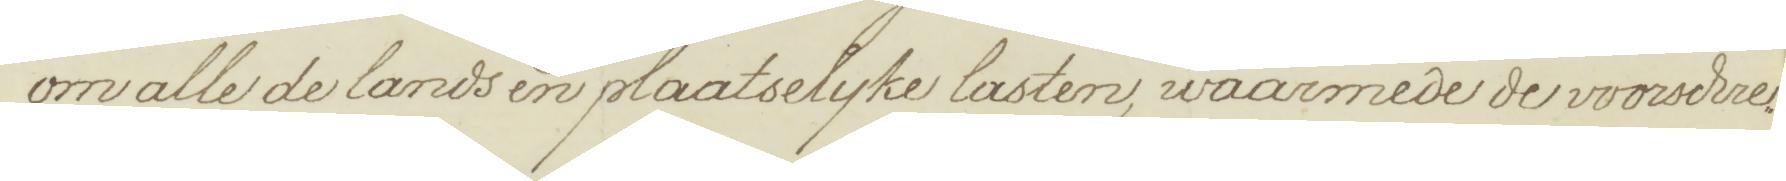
om alle de lands en plaatselyke lasten, waarmede de voorschre„
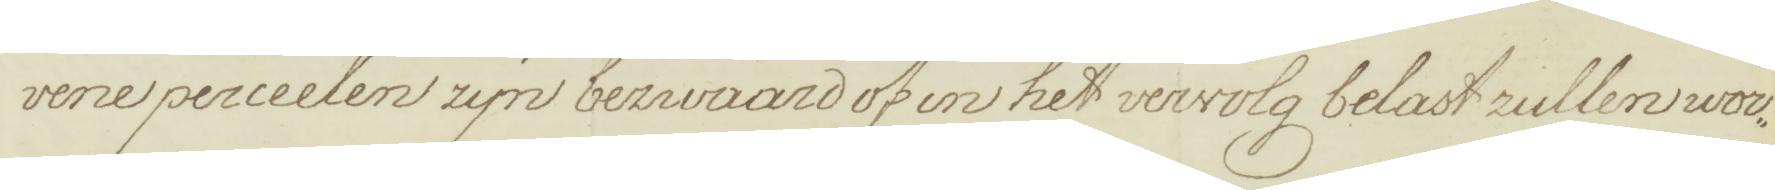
vene perceelen zyn bezwaard op in het vervolg belast zullen wor„
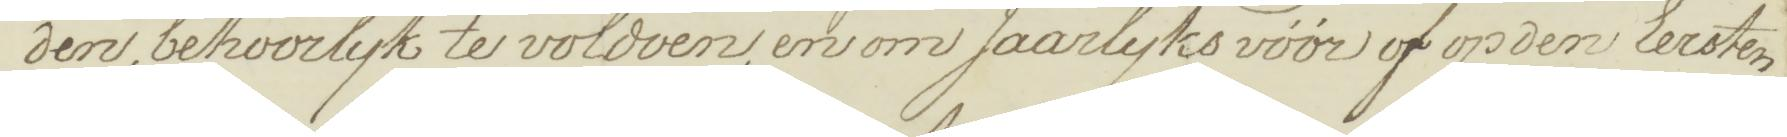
den, behoorlyk te voldoen, en om Jaarlyks vóór of op den Eersten
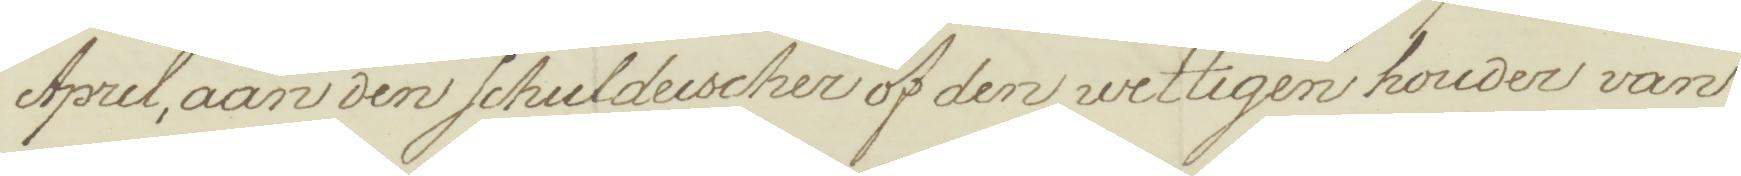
April, aan den schuldeischer of den wettigen houder van
